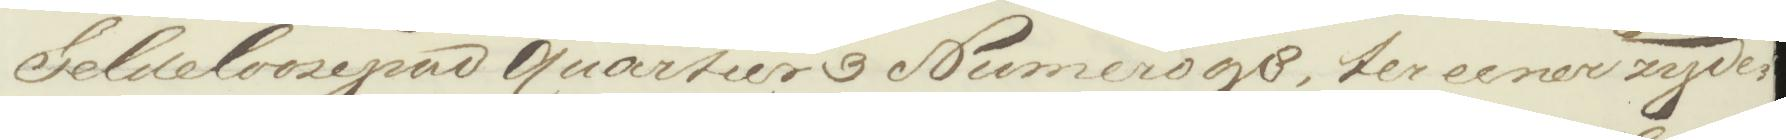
Geldeloozepad Quartier 3 Numero 98, ter eener zyde
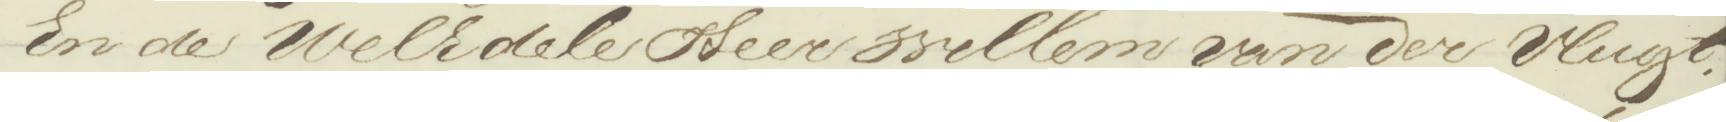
En de WelEdele Heer Willem van der Vlugt
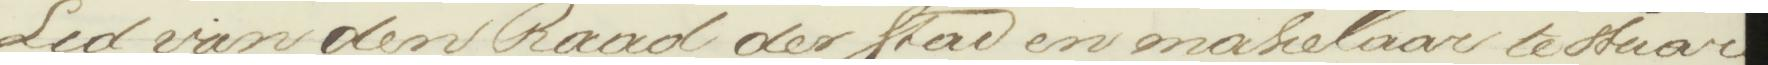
Lid van den Raad der Stad en makelaar te Haar
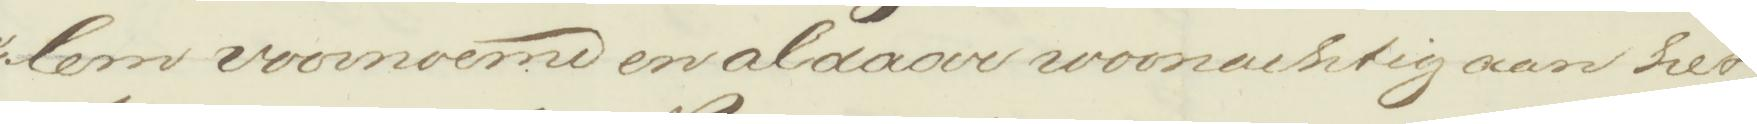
lem voornoemd en aldaar woonachtig aan het
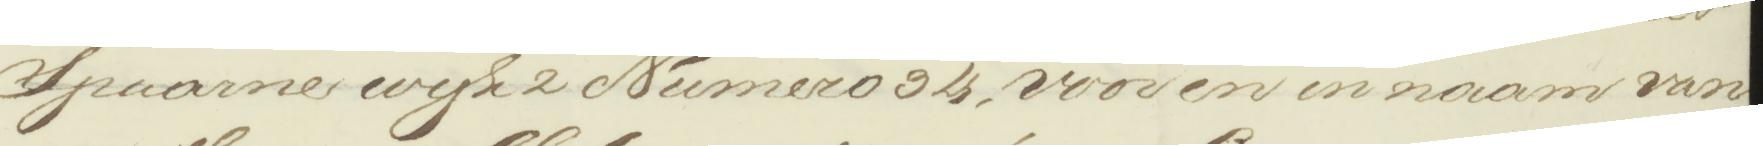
Spaarne wyk 2 Numero 34, voor en in naam van
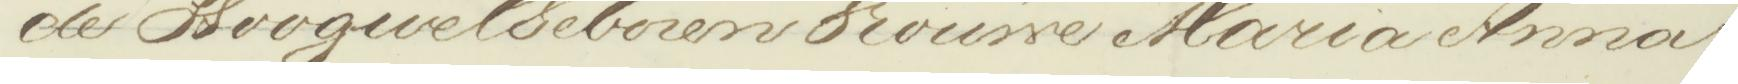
de HoogwelGeboren Vrouwe Maria Anna
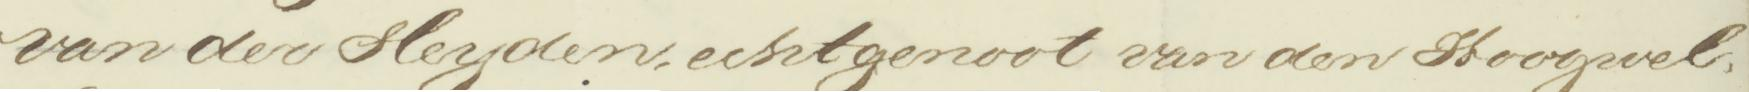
van der Heyden, echtgenoot van den Hoogwel.
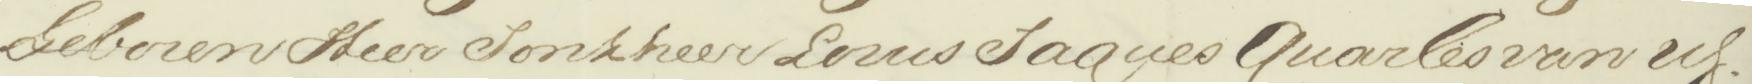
Geboren Heer Ionkheer Louis Iaques Quarles van Uf„
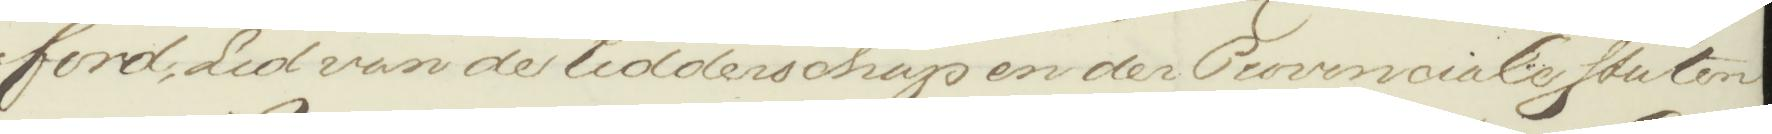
ford, Lid van de ridderschap en der Provinciale Staten
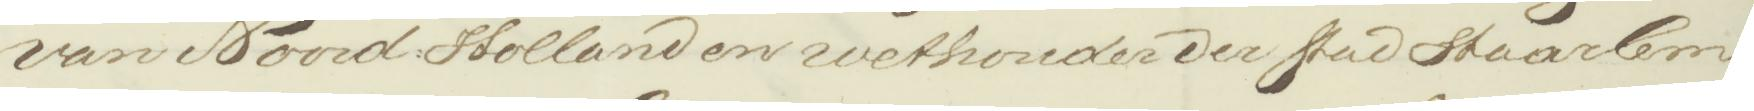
van Noord: Holland en wethouder der Stad Haarlem
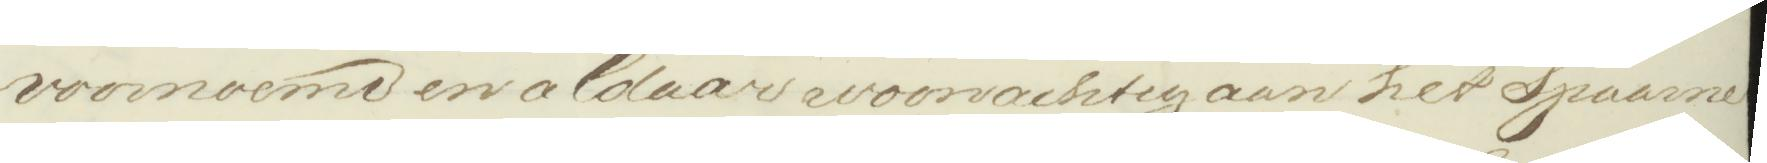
voornoemd en aldaar woonachtig aan het Spaarne
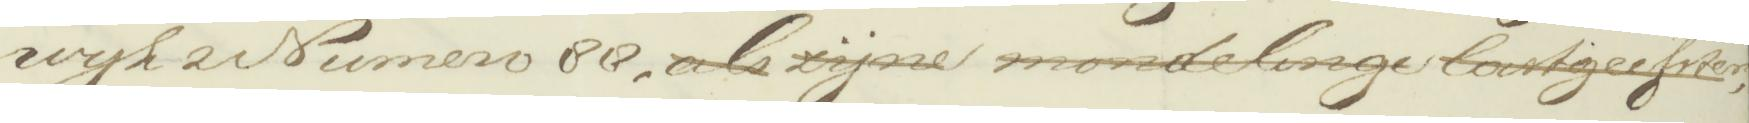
wyk 2 Numero 88, als zijne mondelinge lastgeefster
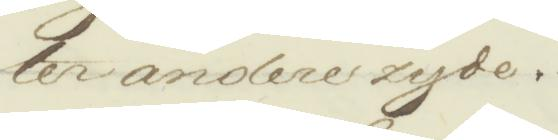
ter andere zyde.
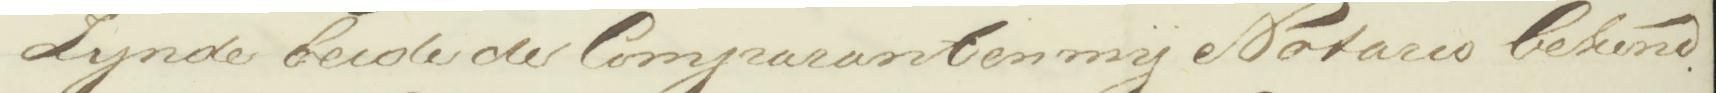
Zynde beide de Comparant en mij Notaris bekend
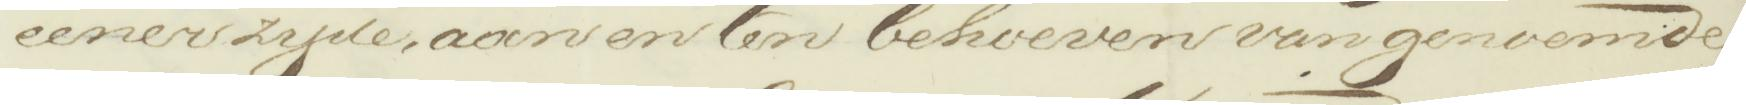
eener zyde, aan en ten behoeven van genoemde
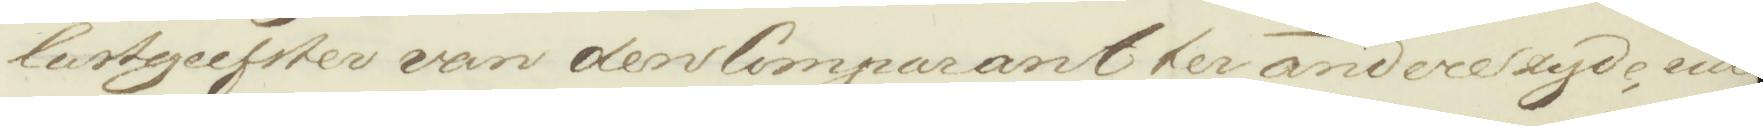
lastgeefster van den Comparant ter andere zyde, uit
